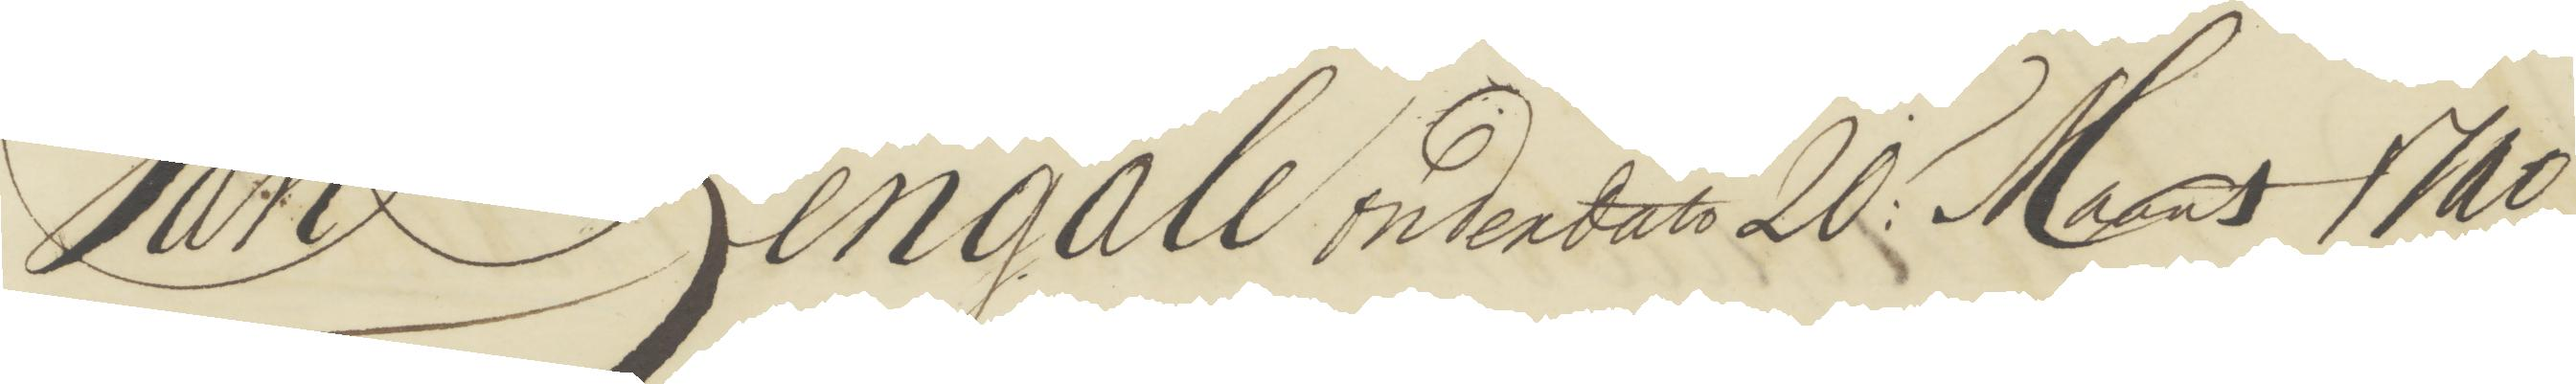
Van Bengale onderdato 20:' Maart 1740
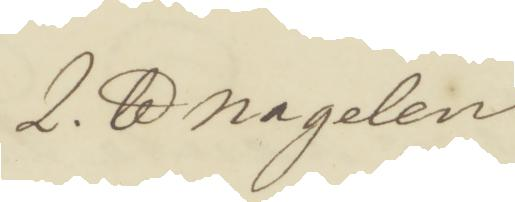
2. lb nagelen
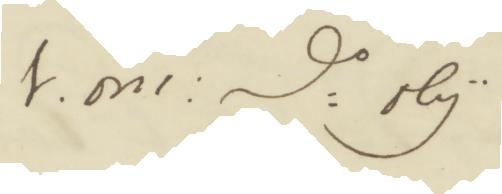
1. oni: _:o olij
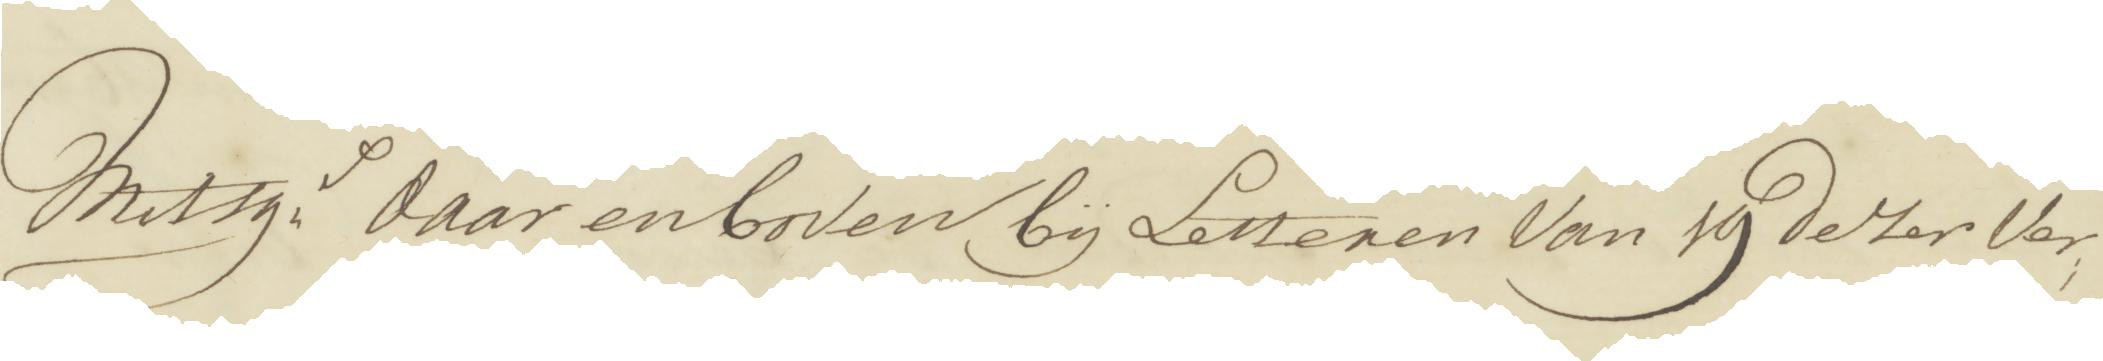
Mitsg:s daar enboven bij Letteren van 19 dezer ver„
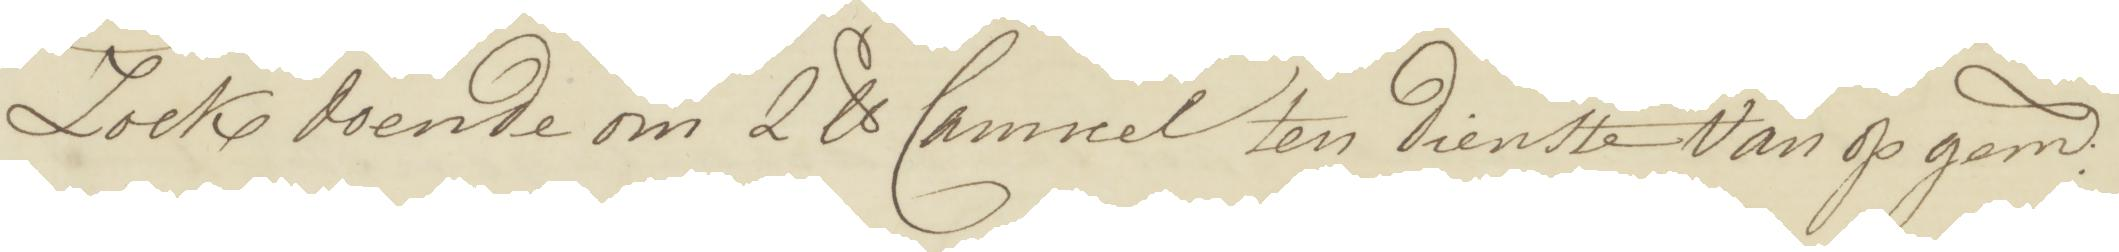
zoek doende om 2 lb Canneel ten dienste van op gem:
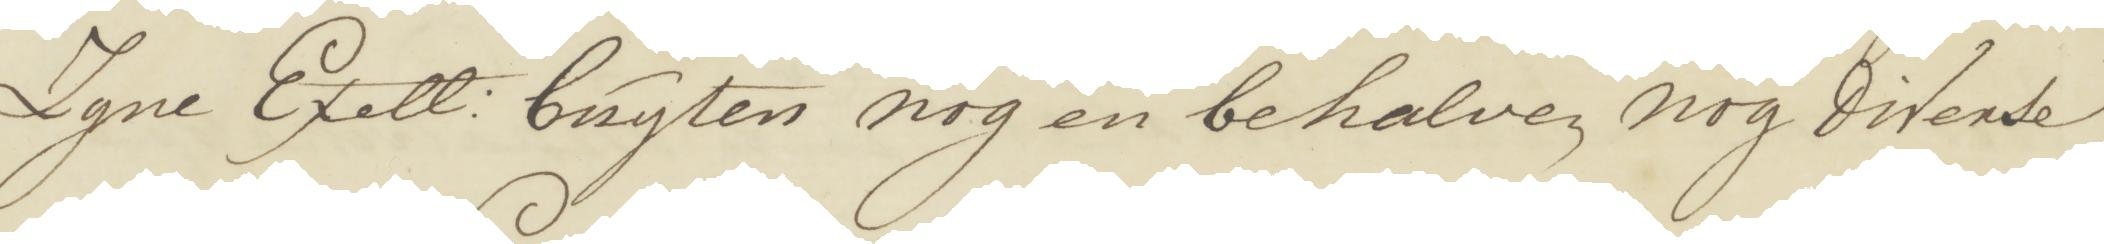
zyne Exell: buijten nog en behalven nog diverse
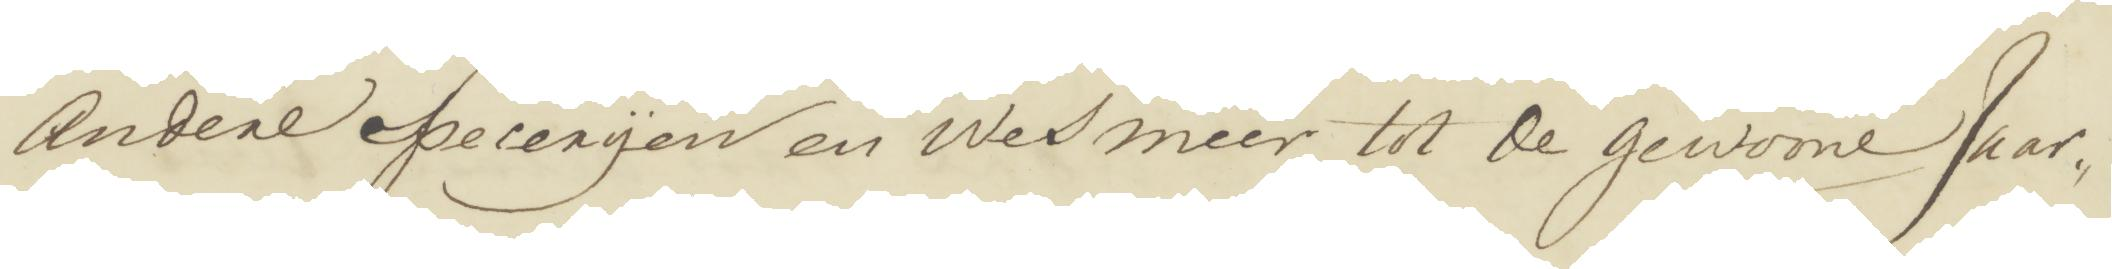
andere specerijen en wes meer tot de gewoone Jaar„
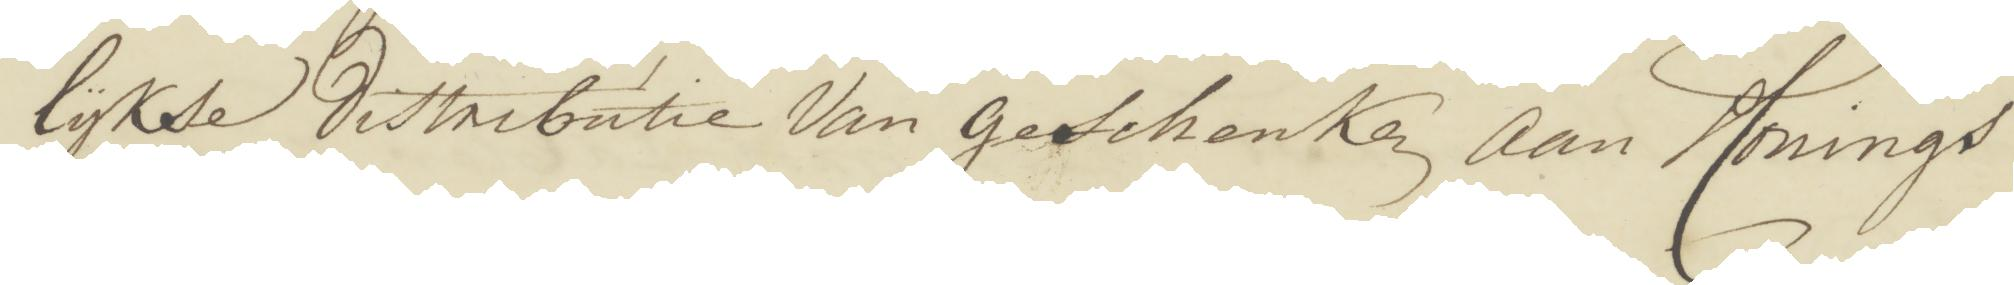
lijkse distributie van geschenken aan Konings
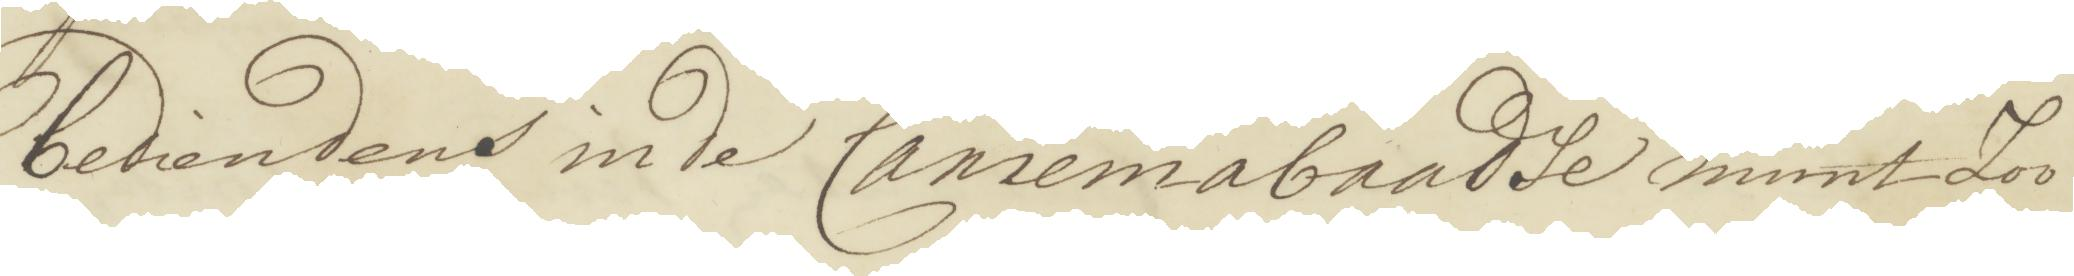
bediendens in de Cariemabaadse munt zoo
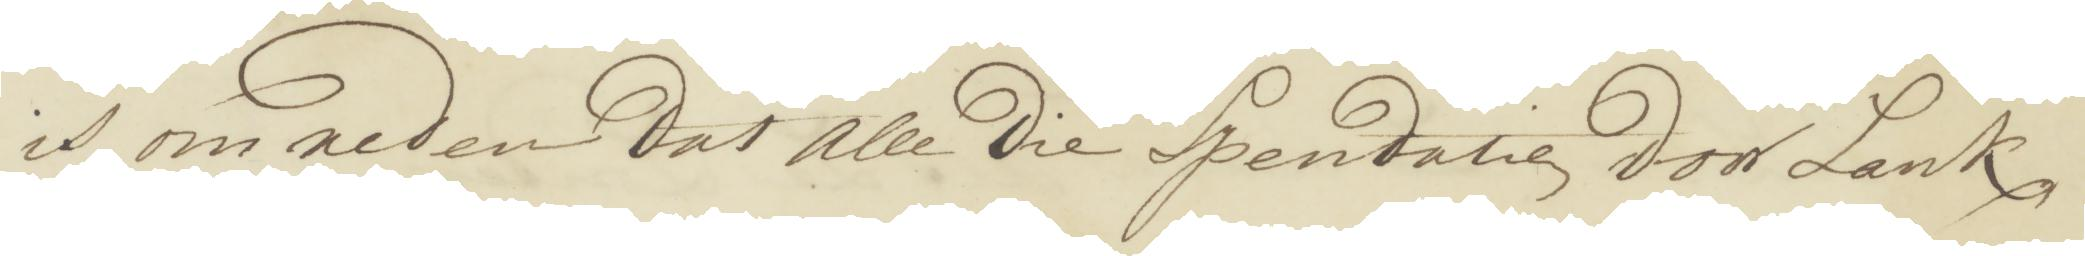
is, om reden dat alle die spendatien door lank
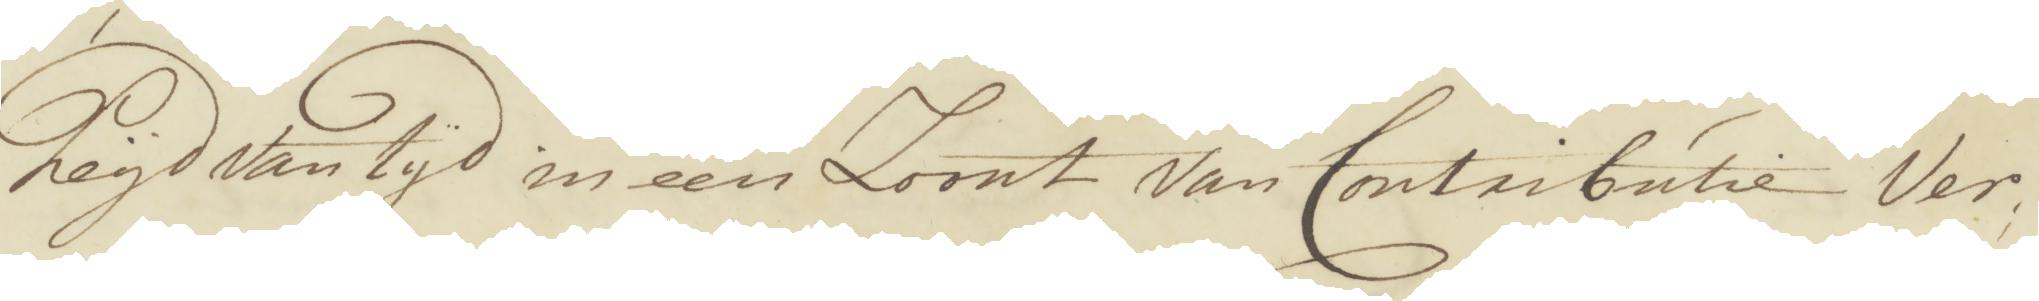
heijd van tijd in een zoort van Contributie ver„
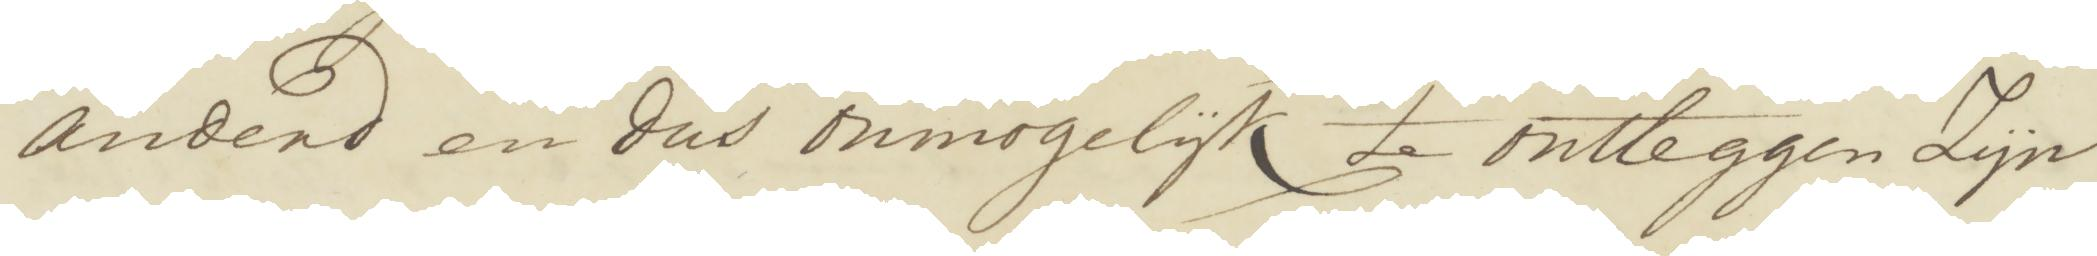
anderd en dus onmogelijk te ontleggen zijn
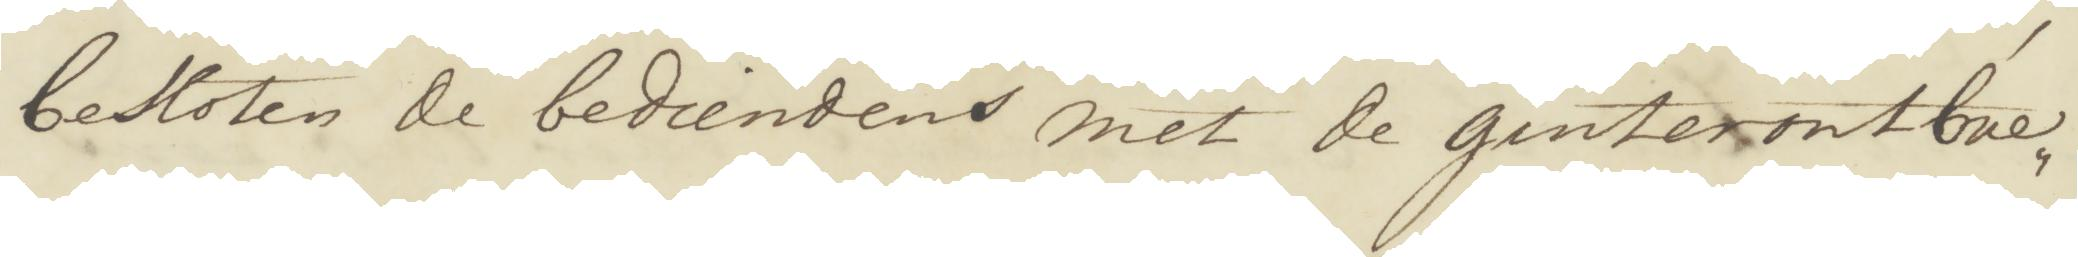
besloten de bediendens met de ginter ontbre„
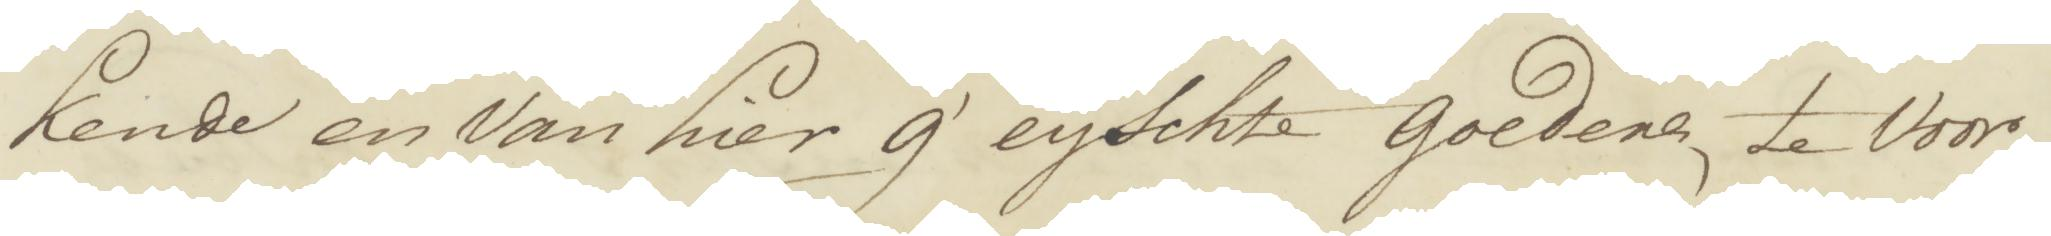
kende en van hier g’ eijschte goederen te voor
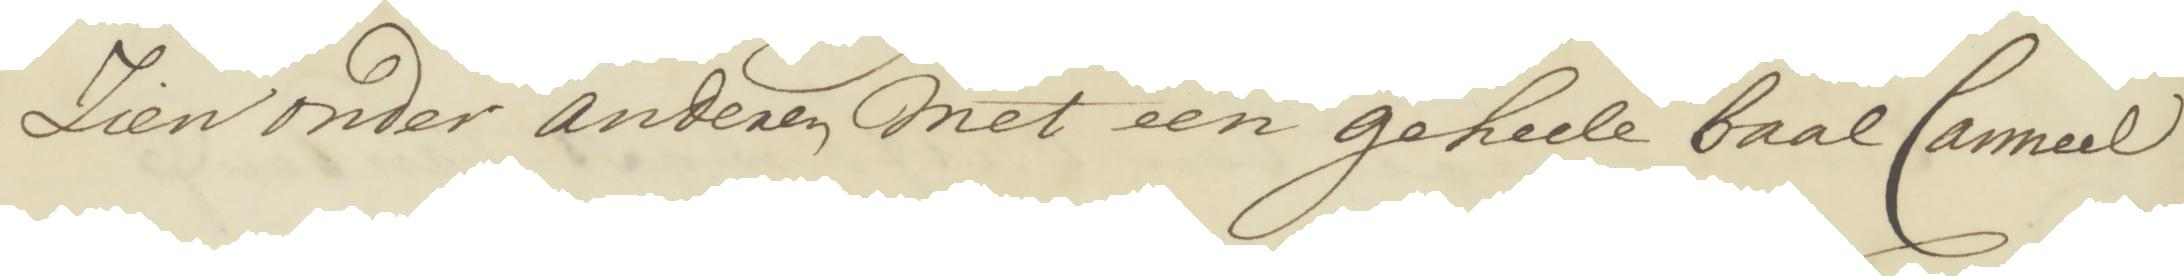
zien onder anderen met een geheele baal Canneel
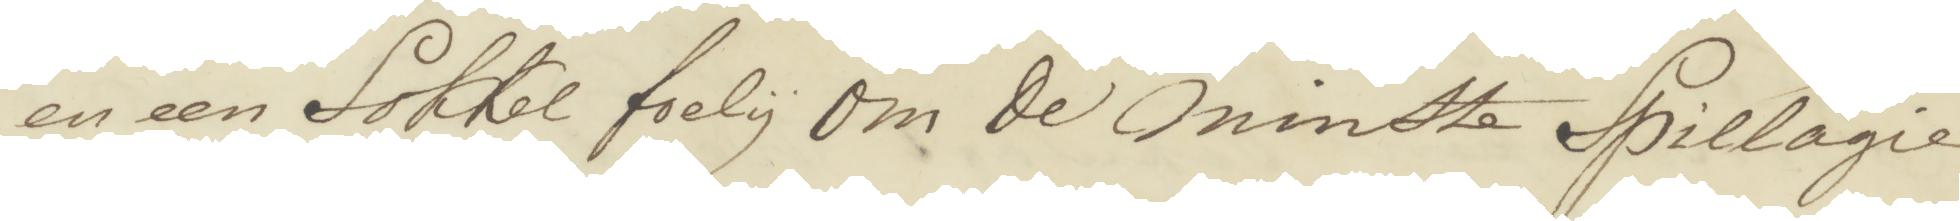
en een sokkel foelij om de minste spillagie
